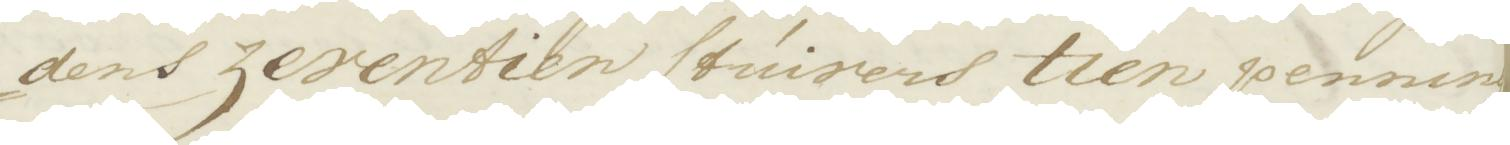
=dens zeventien stuivers tien pennin
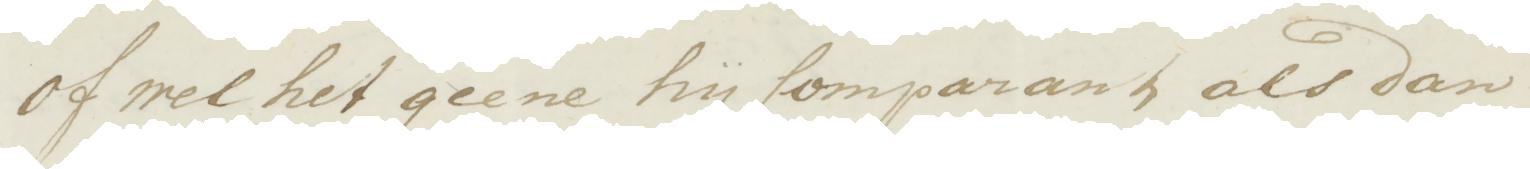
of wel het geene hij Comparant als dan
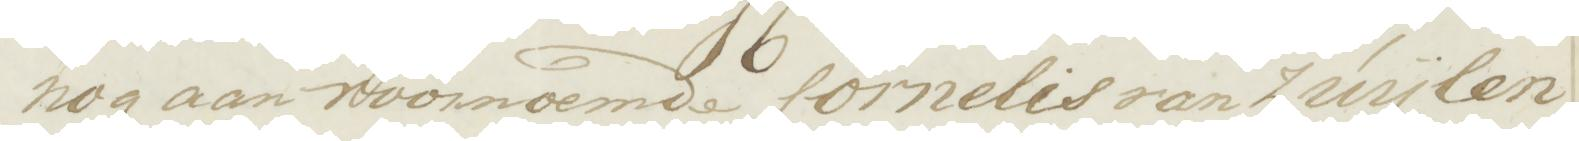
nog aan voornoemde Cornelis van Zuijlen
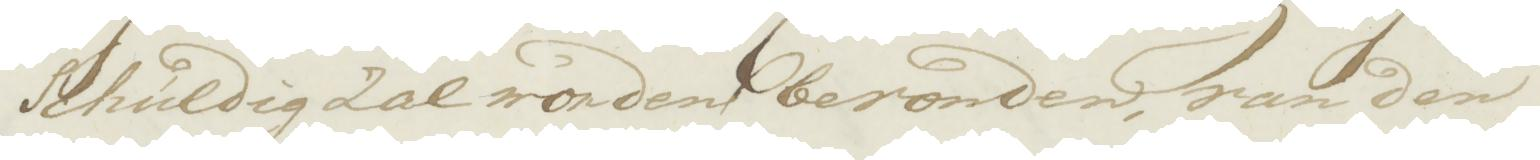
schuldig zal worden bevonden, van den
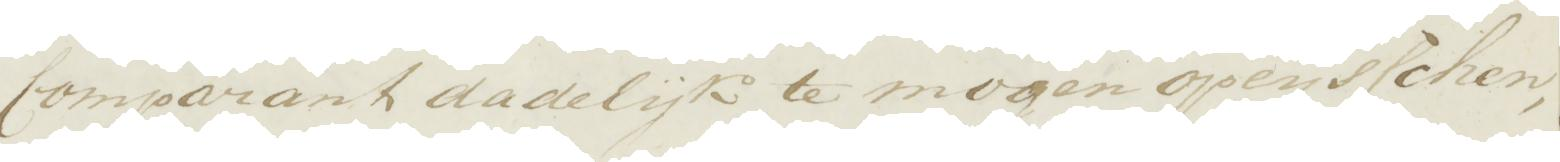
Comparant dadelijk te mogen opeijsschen,
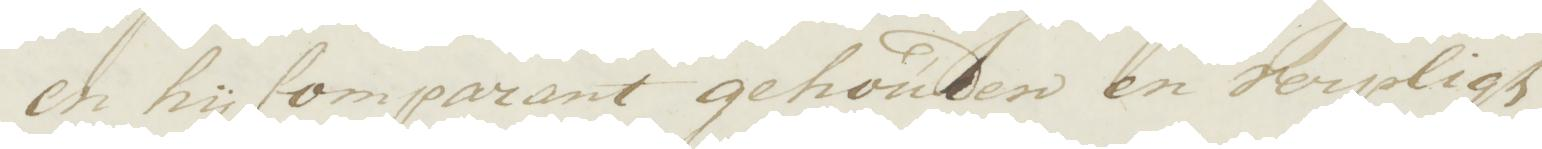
en hij Comparant gehouden en verpligt
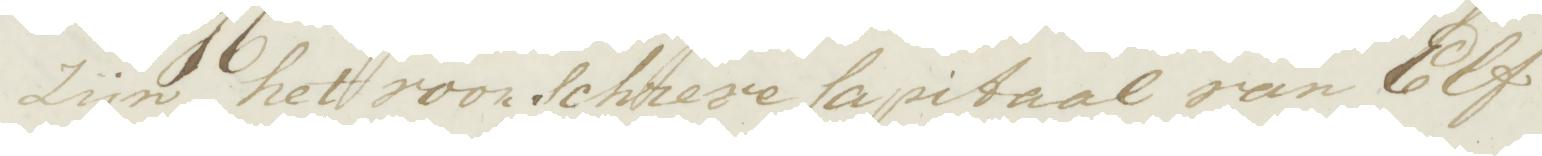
zijn, het voorschreve Capitaal van Elf
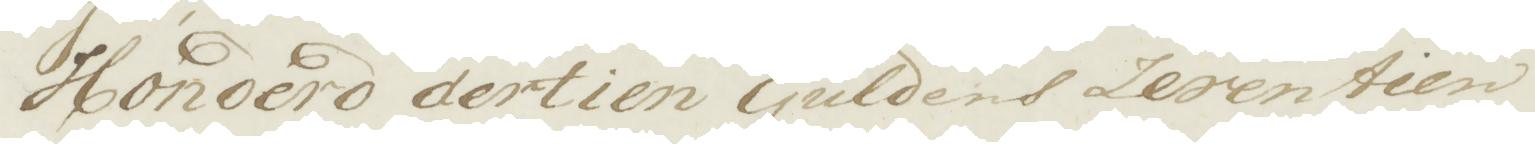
Honderd dertien Guldens zeventien
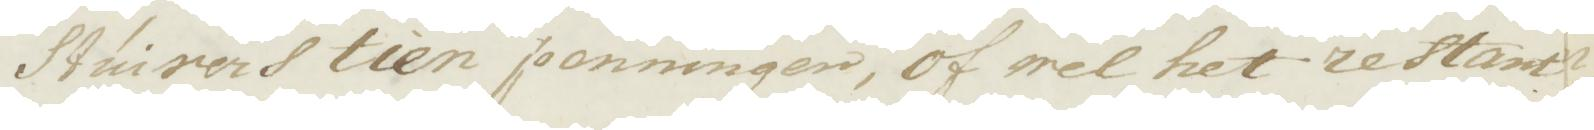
stuivers tien penningen, of wel het restant
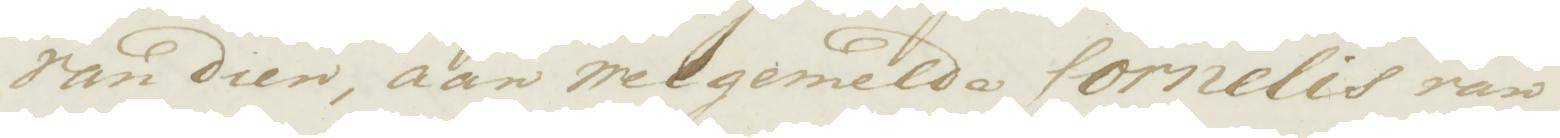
van dien, aan welgemelde Cornelis van
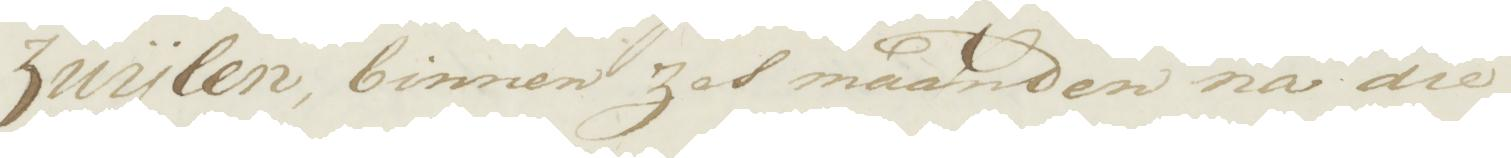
Zuijlen, binnen zes maanden na die
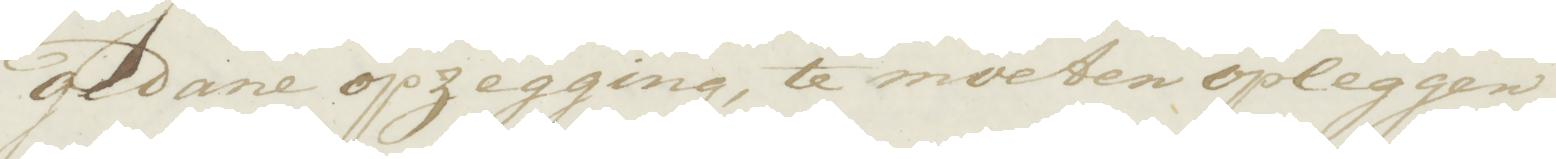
gedane opzegging, te moeten opleggen
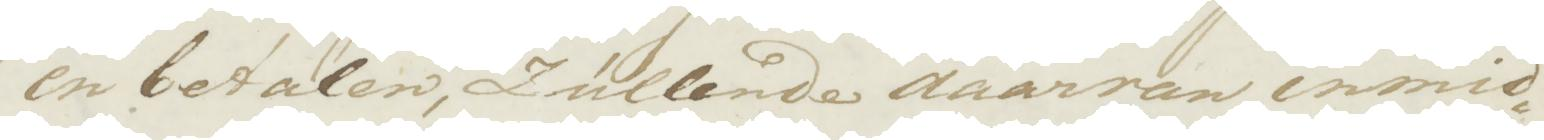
en betalen, zullende daarvan inmid=
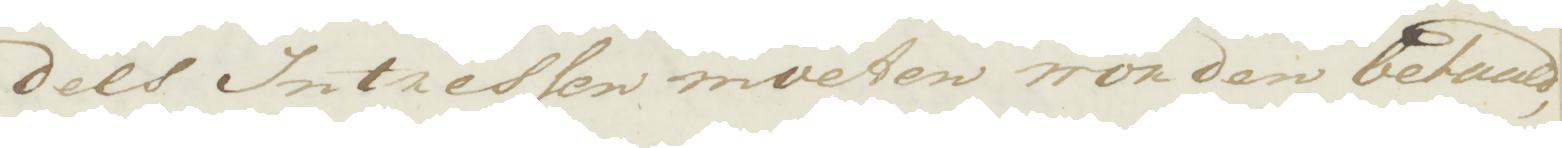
=dels Intressen moeten worden betaald,
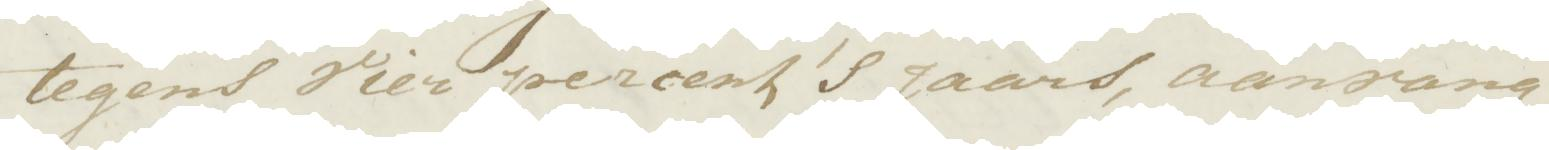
tegens Vier percent 's jaars, aanvang
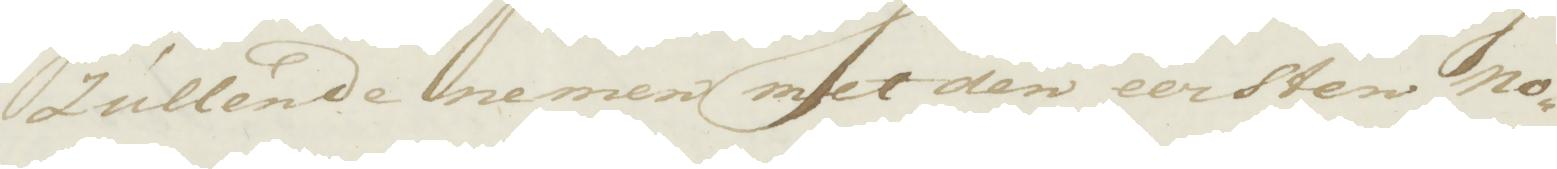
zullende nemen met den eersten No„
